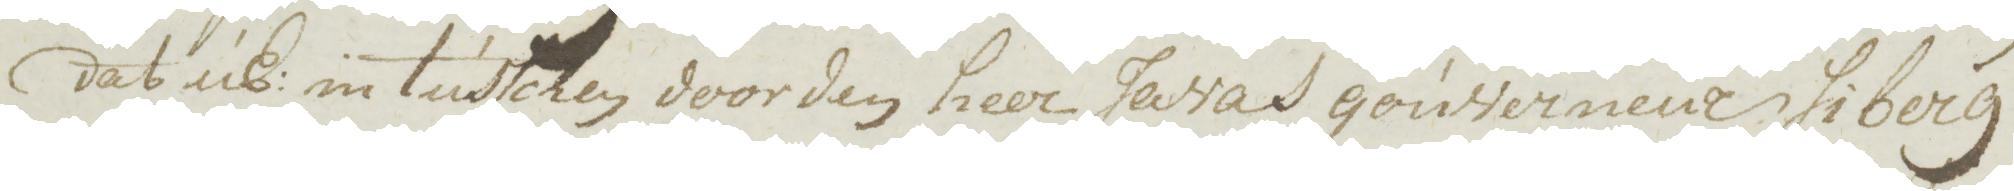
dat uE: in tusschen door den heer Javas gouverneur Siberg
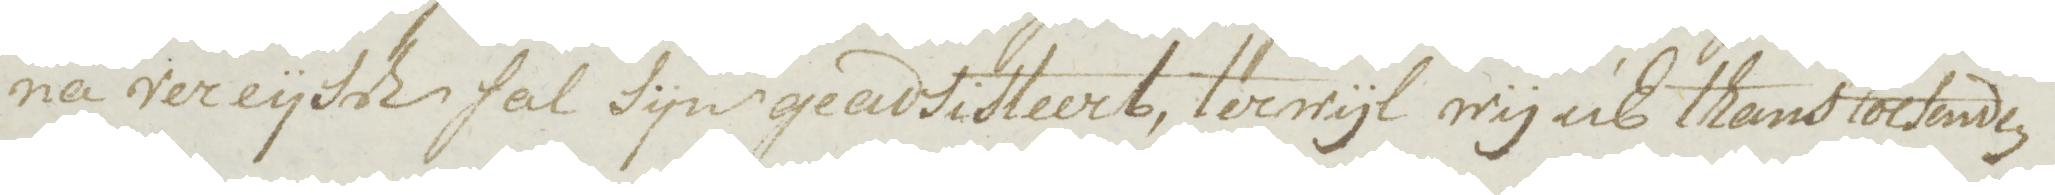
na vereijsch sal sijn geadsisteert, terwijl wij uE thans toesenden
